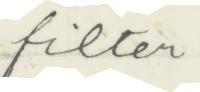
filter
